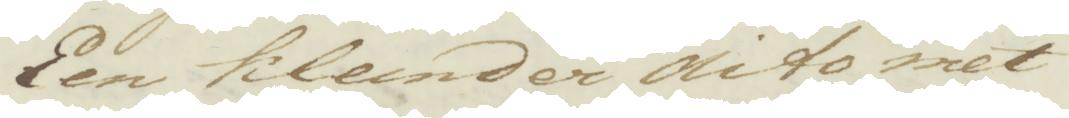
Een kleinder dito met
